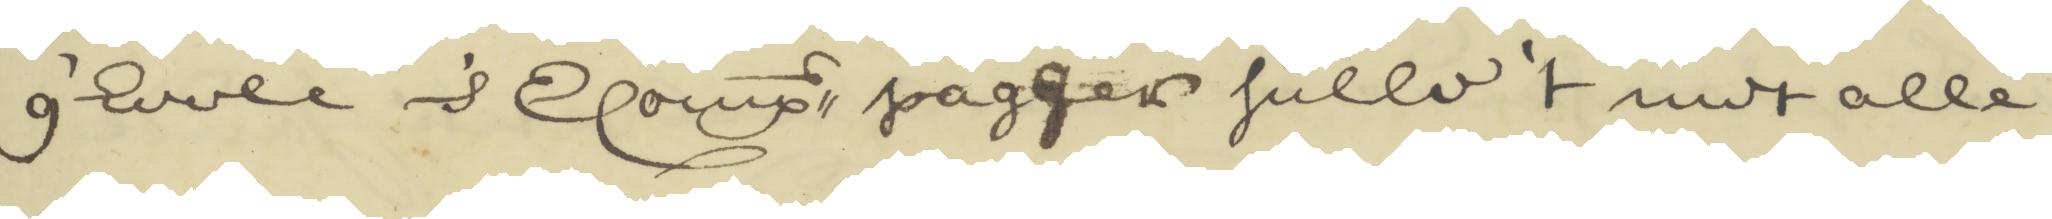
g'Eerde ’s EComp:s pagger sulle ’t met alle
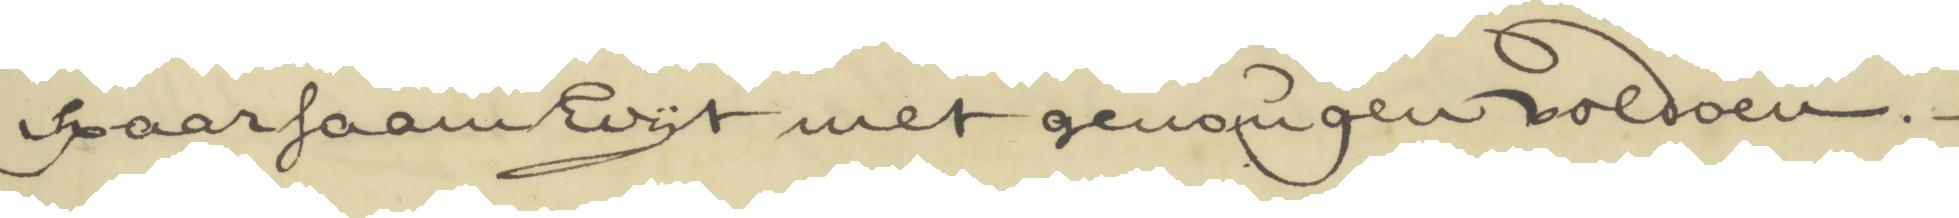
spaarsaamheijt met genougen voldoen.
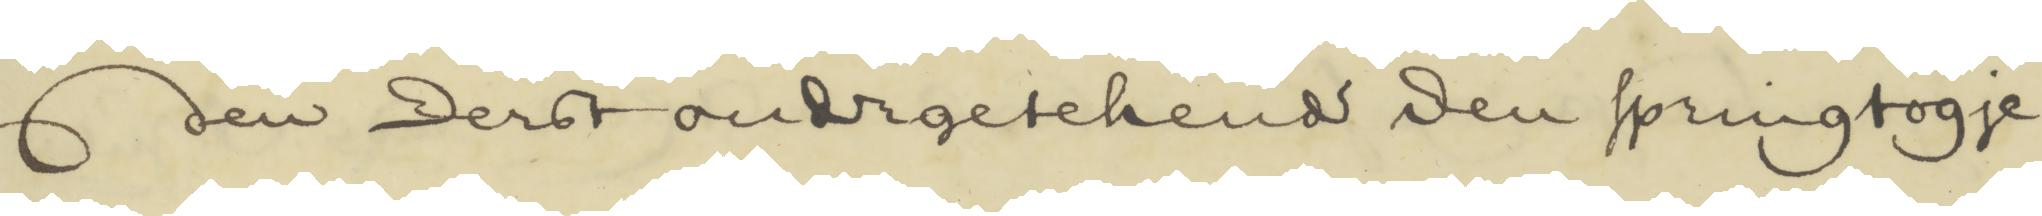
den Eerst ondergetekende den springtogje
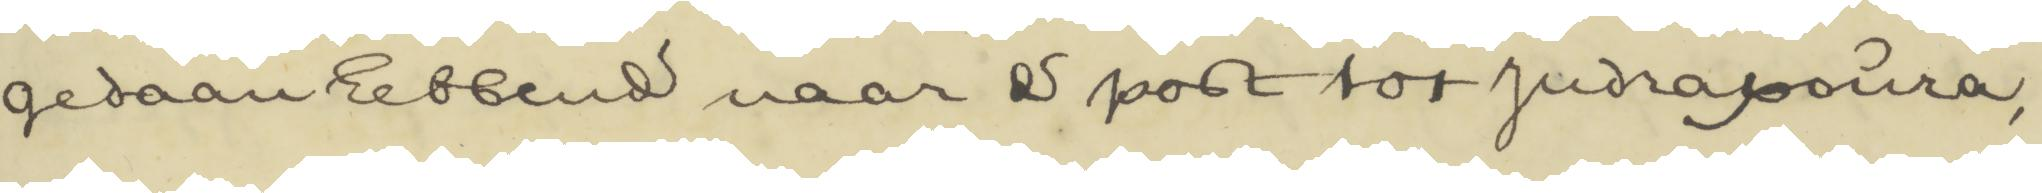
gedaan hebbende naar de post tot jndrapoura,
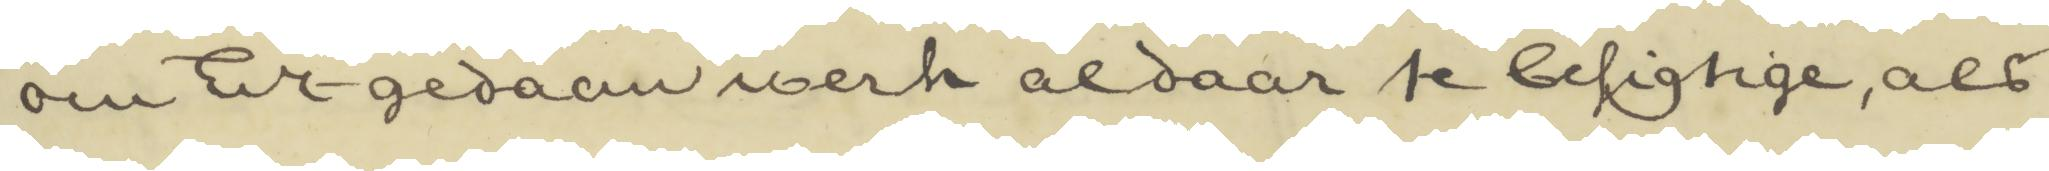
om het gedaan werk aldaar te besigtige, als
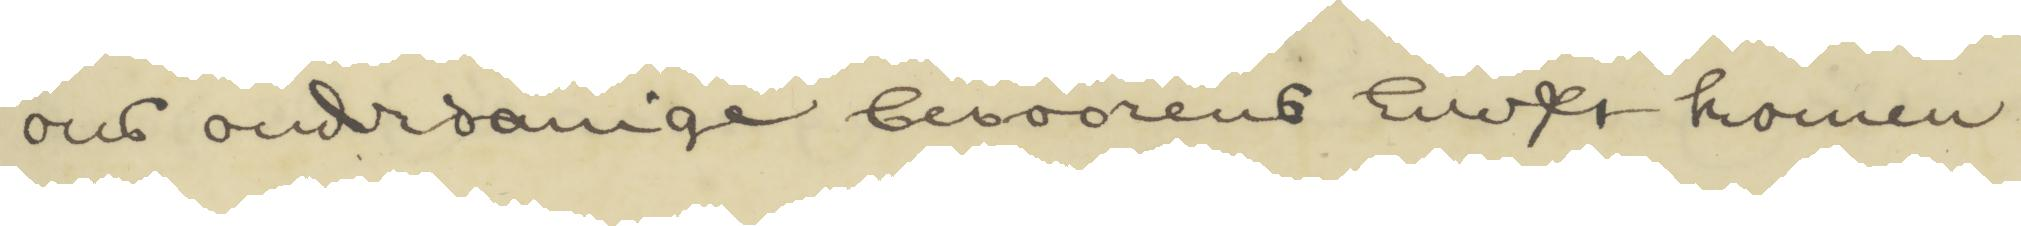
ons onderdanige bevoorens heeft komen
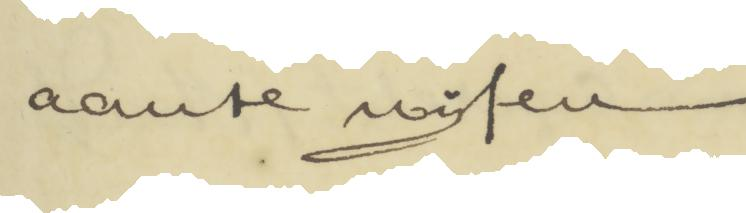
aante wijsen.
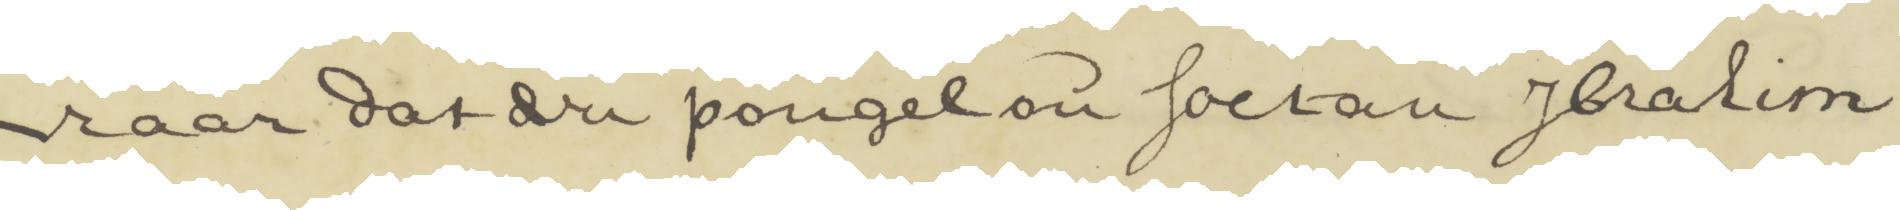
Naar dat den pongelou soetan Jbrahim
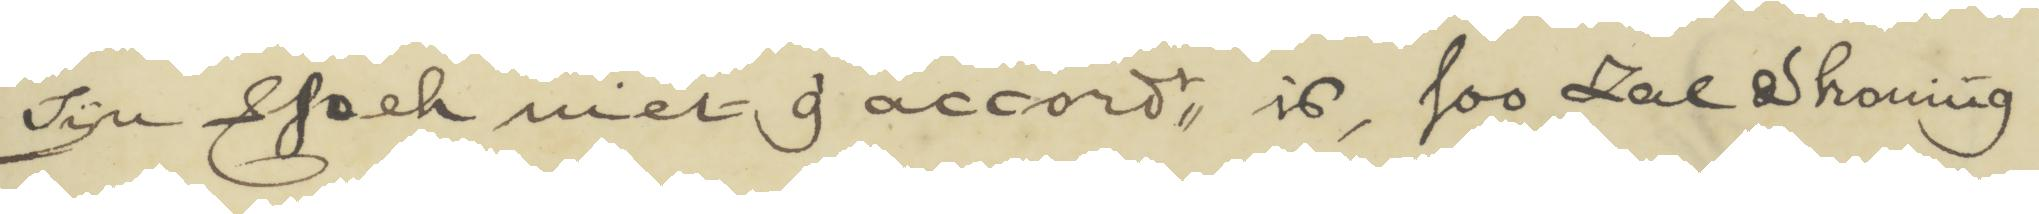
sijn versoek niet gaccord„t is, soo zal de koning
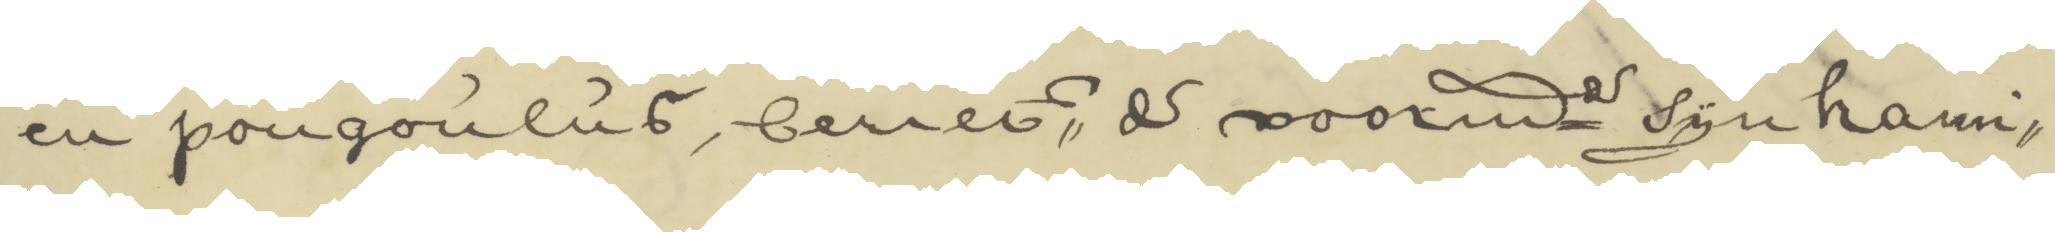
en pongoulus, benev„s de voorm=e sijn kanni„
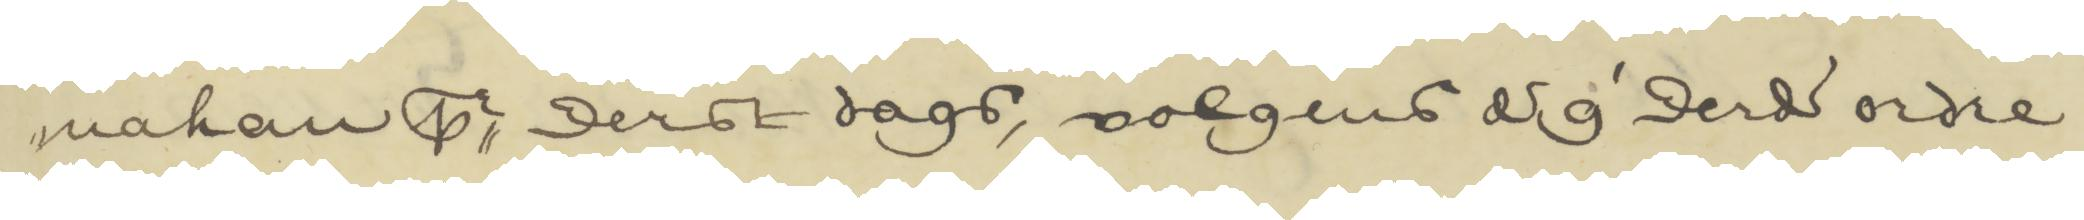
„nakan pr Eerst dags, volgens de g’eerde ordre
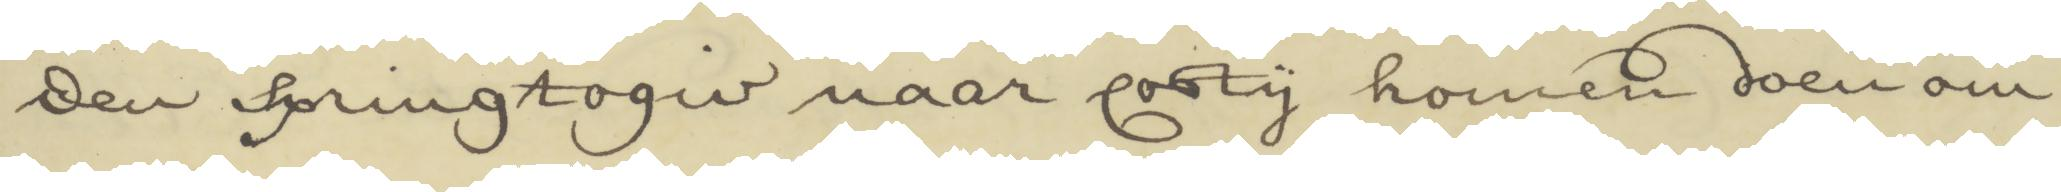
den springtogie naar costij komen doen om
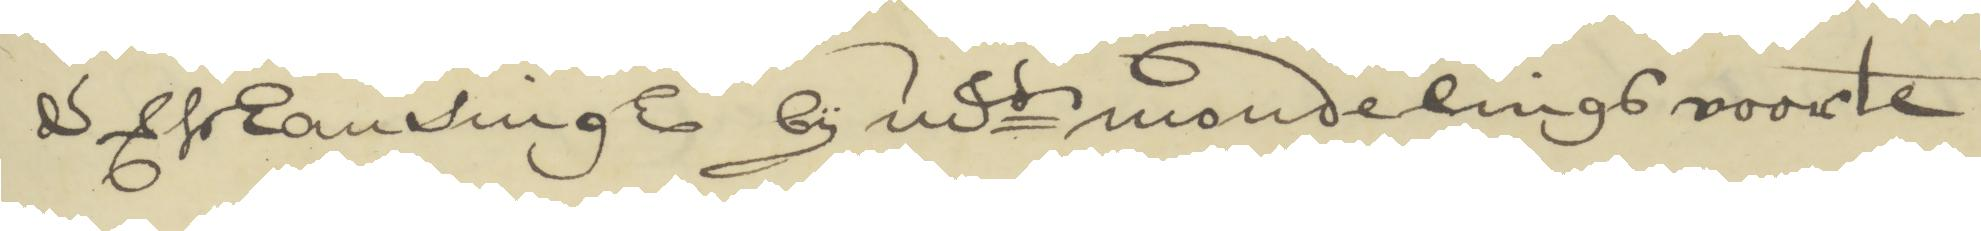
de verschansingh bij uE=s mondelings voor te
